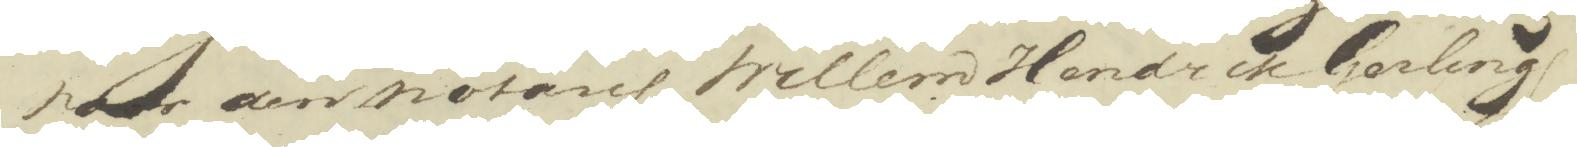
voor den notaris Willem Hendrik Gorling
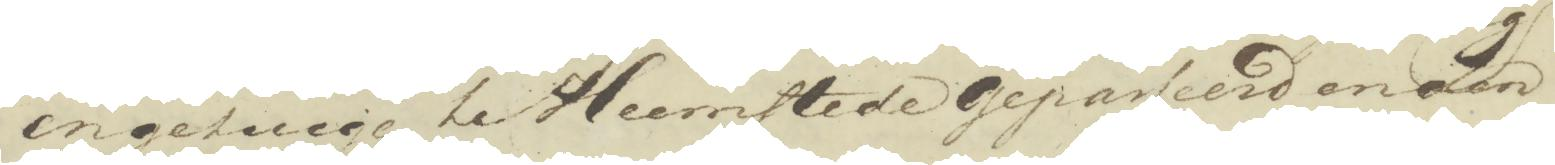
en getuigen te Heemstede gepasseerd en den
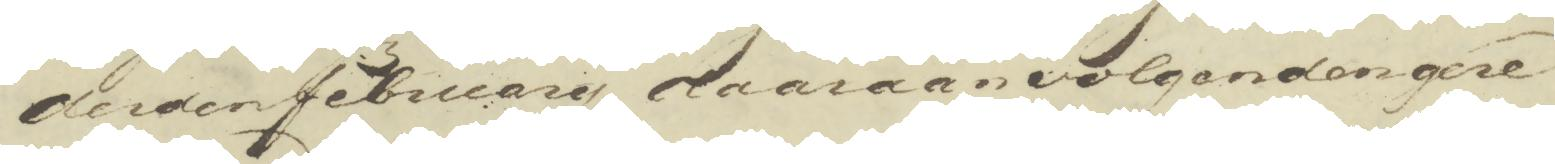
derden february daaraan volgenden gere
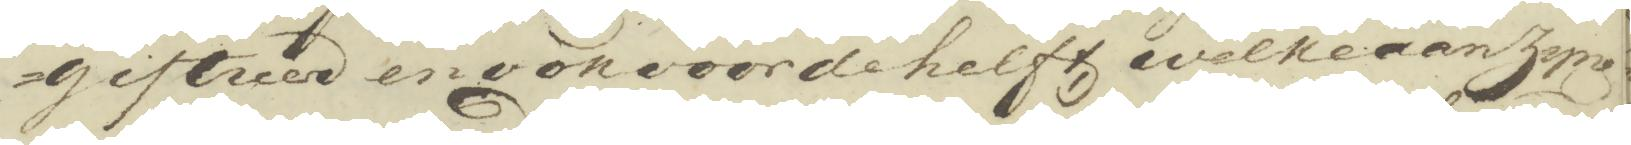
=gistreerd en ook voor de helft, welke aan zyne
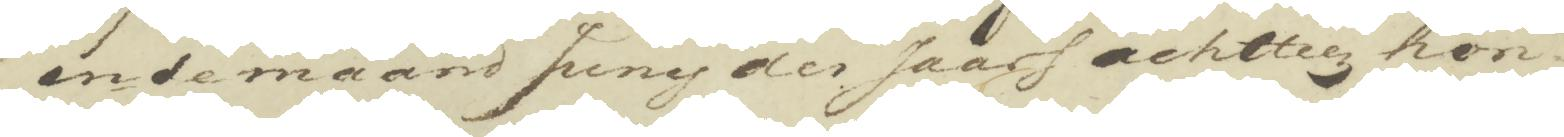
in, de maand Juny des Jaars achttien hon„
